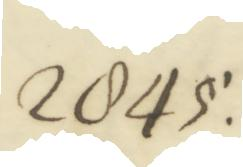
2845
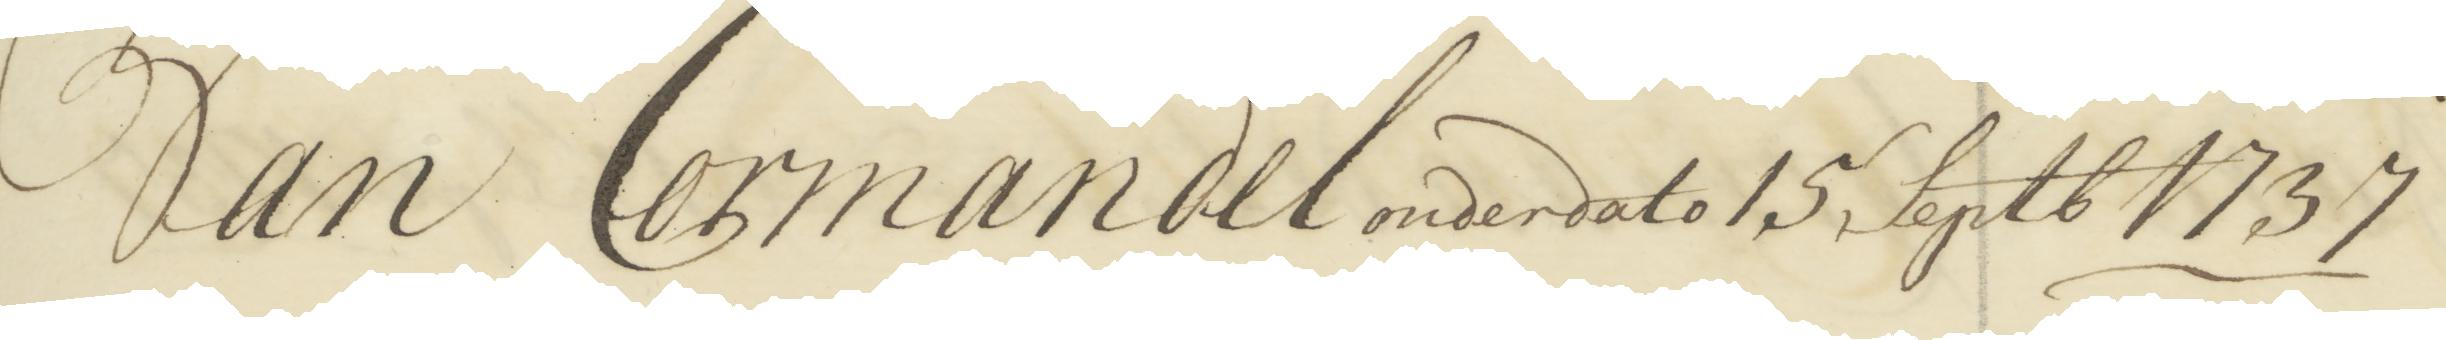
Van Cormandel onderdato 15:' Septb 1737
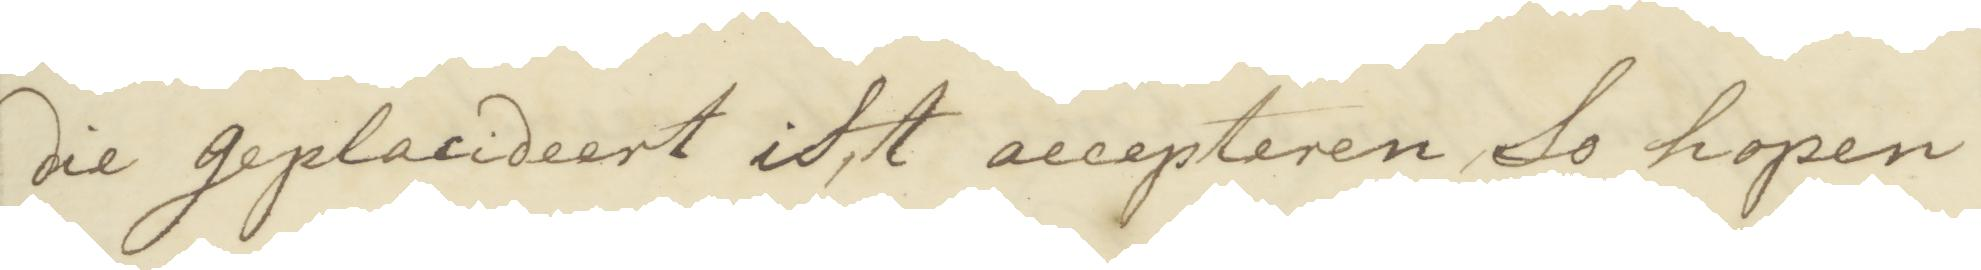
die geplacideert is, t accepteren so hopen
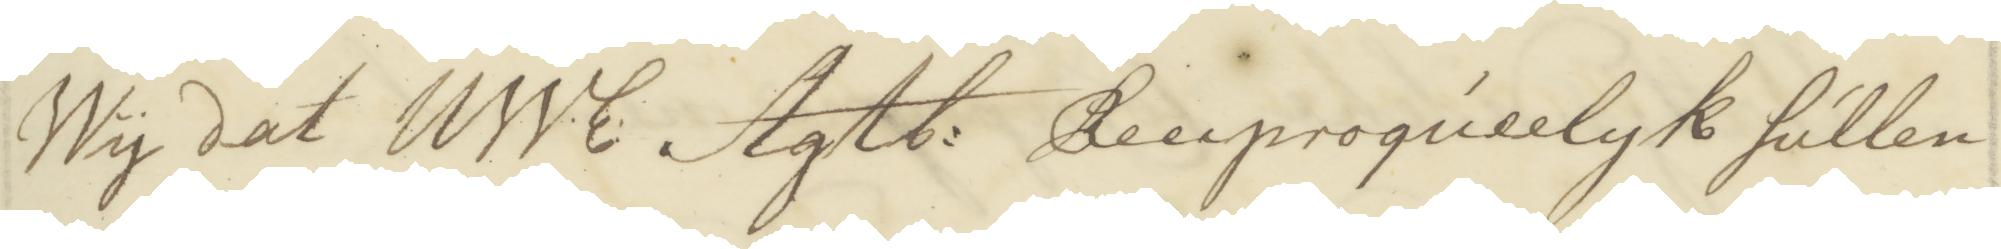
Wij dat UWE Agtb: Reciproqueelyk sullen
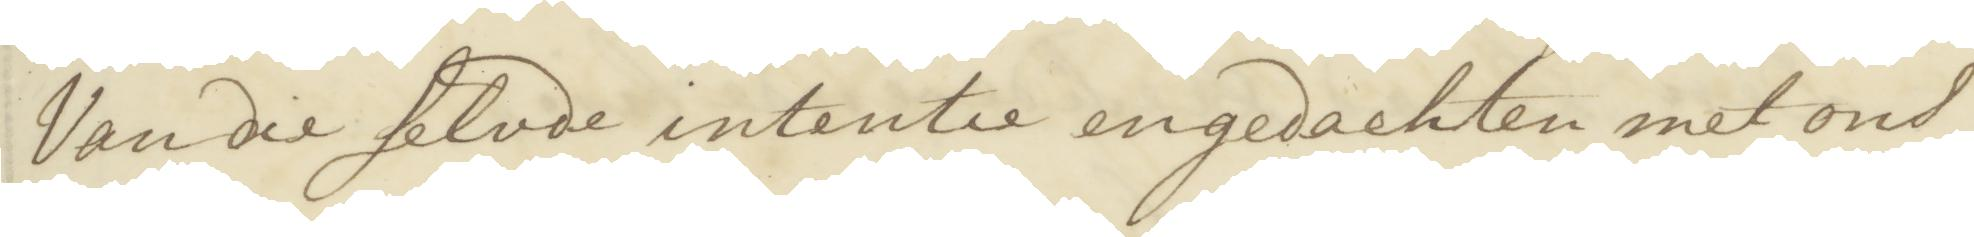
van die selvde intentie en gedachten met ons
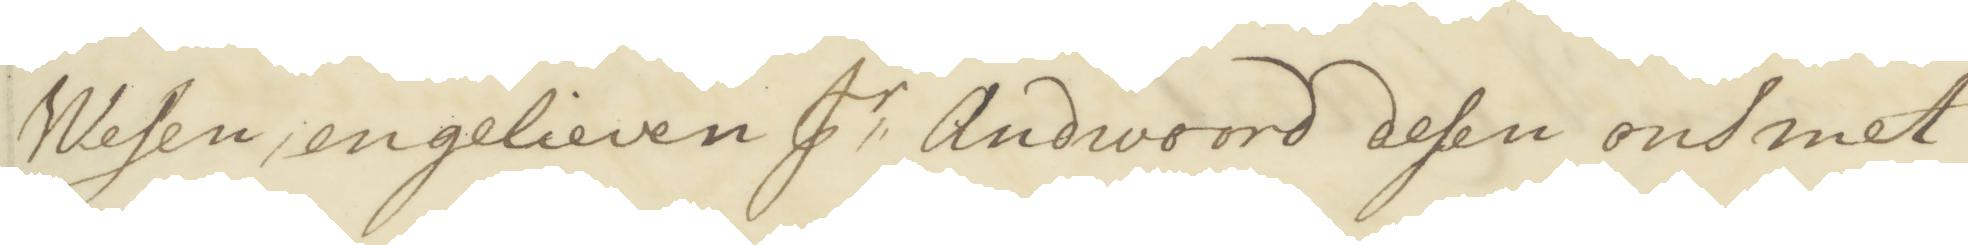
wesen, en gelieven p„r Andwoord desen ons met
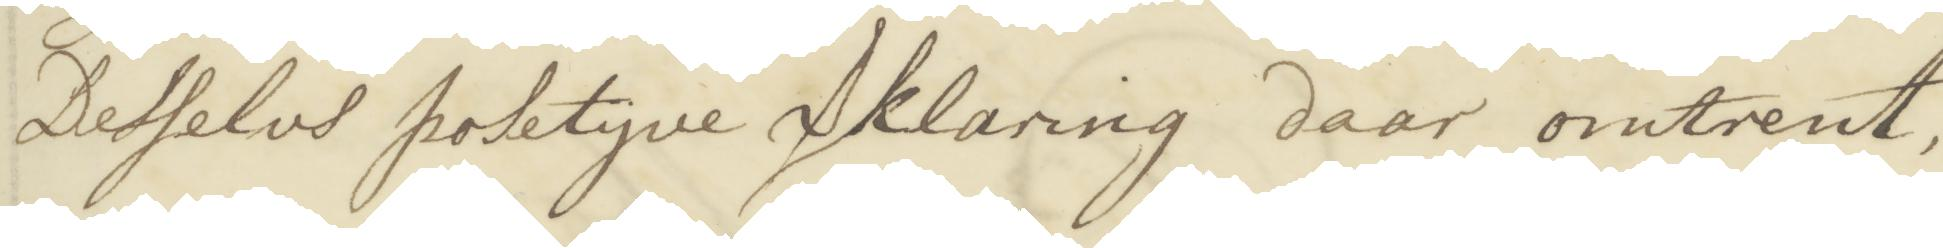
Desselvs posetijve verklaring daar omtrent,
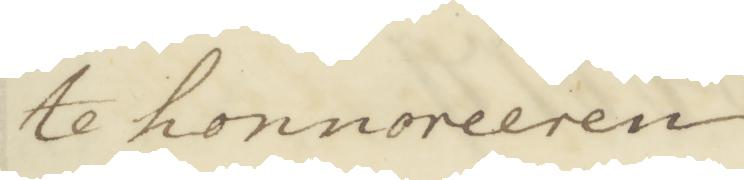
te honnoreeren
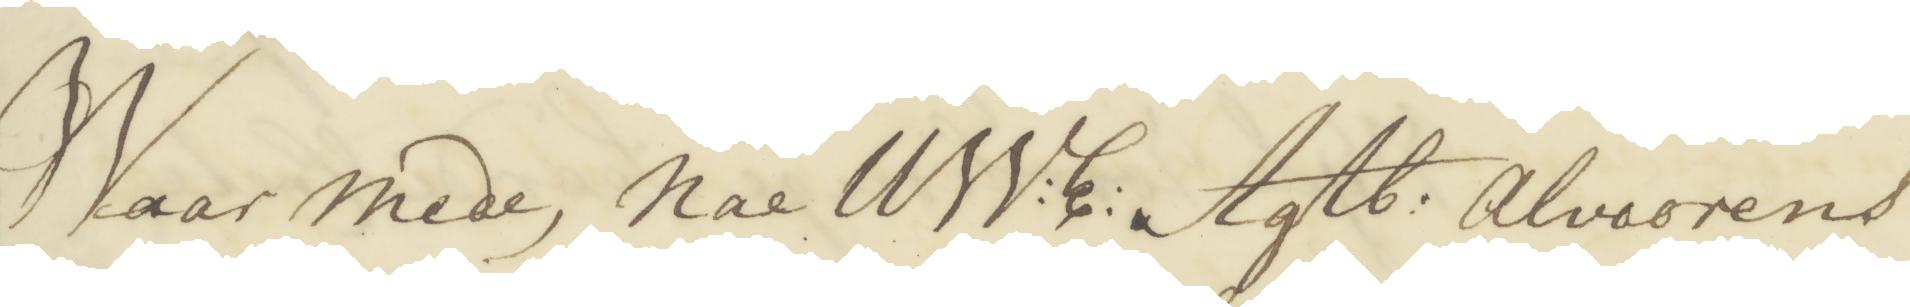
Waar mede, nae UW:E: Agtb: alvoorens
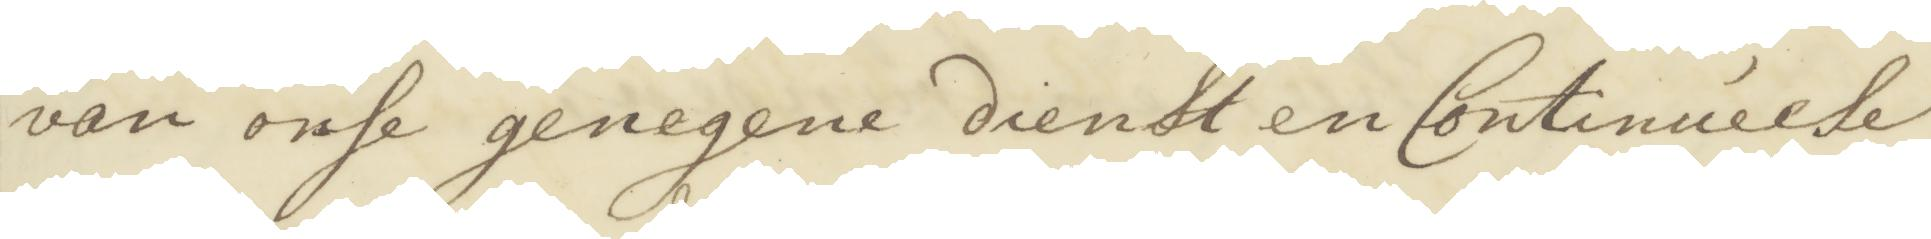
van onse genegene dienst en Continueese
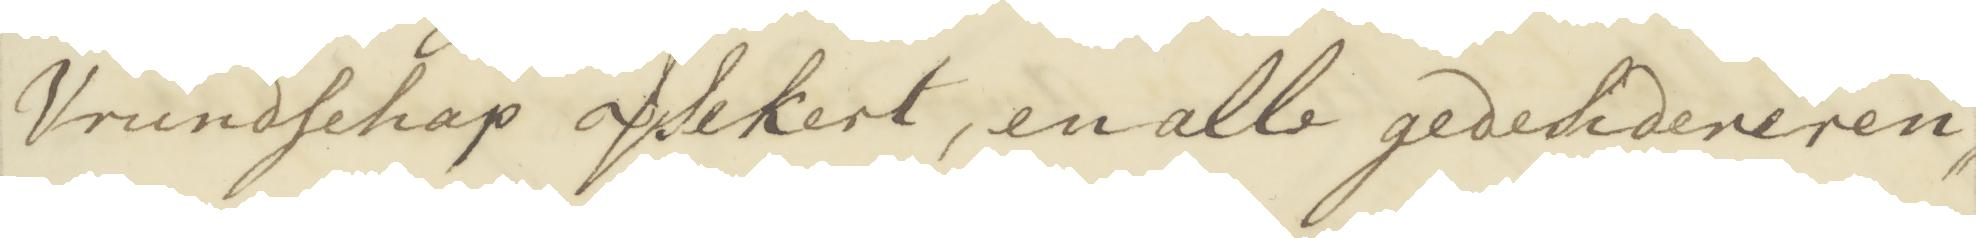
vrundschap versekert, en alle gedesidereren
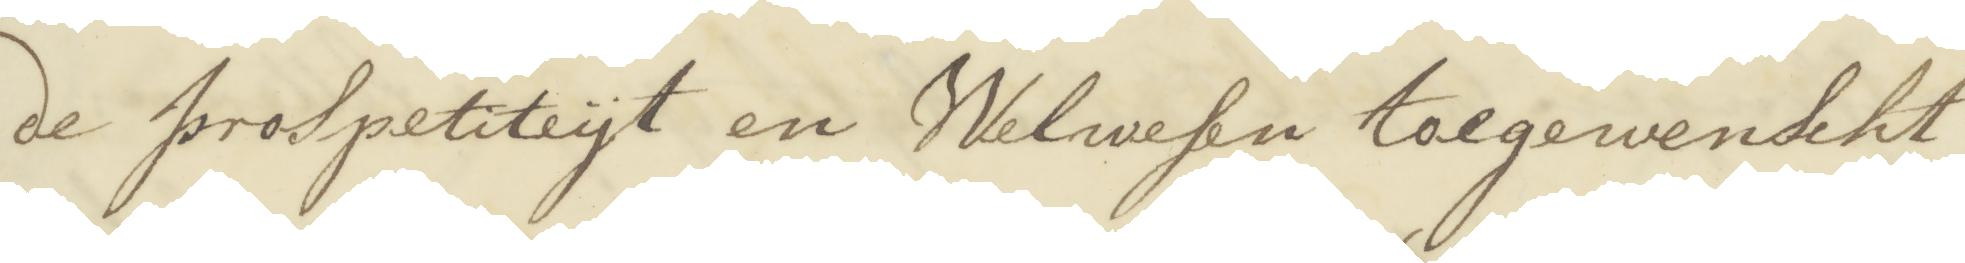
de prospetiteijt en Welwesen toegewenscht
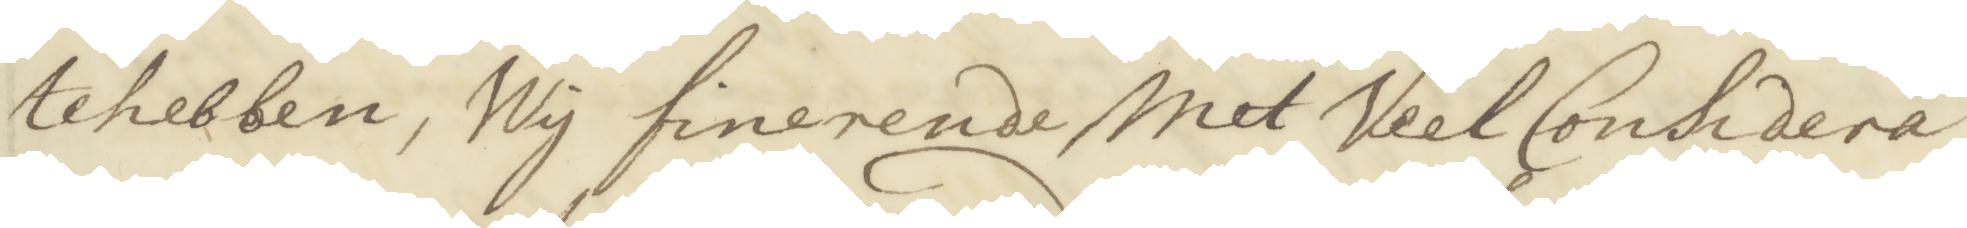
te hebben, wij finerende met veel Considera
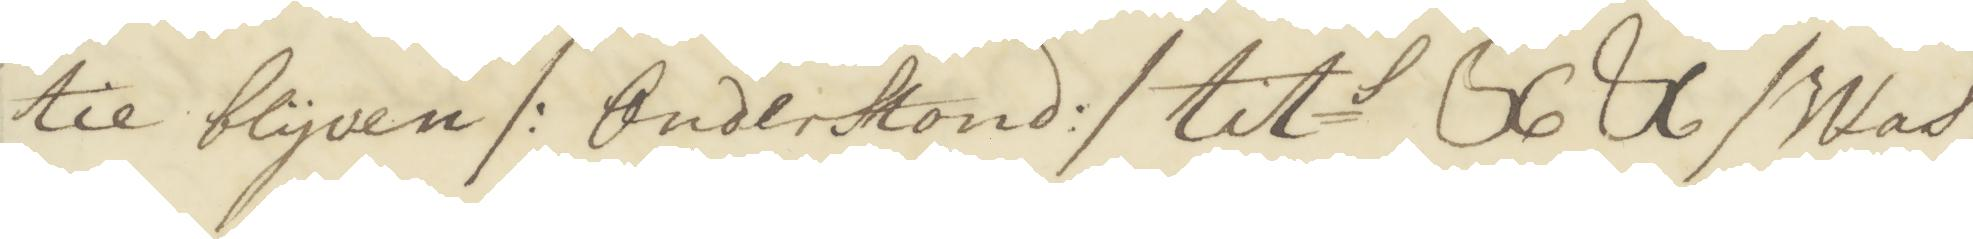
tie blijven /: Onderstond:/ tit=s &C &C / Was
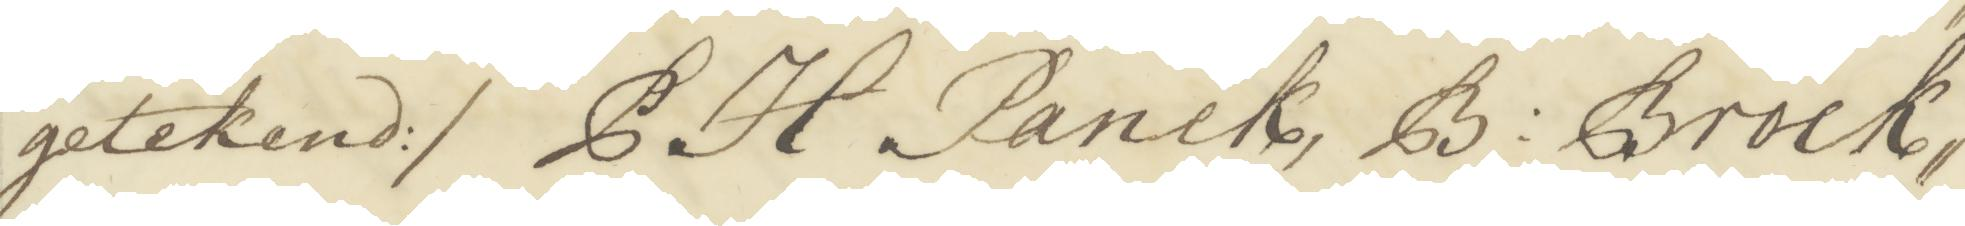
getekend :/ P H Panck, B: Broek„
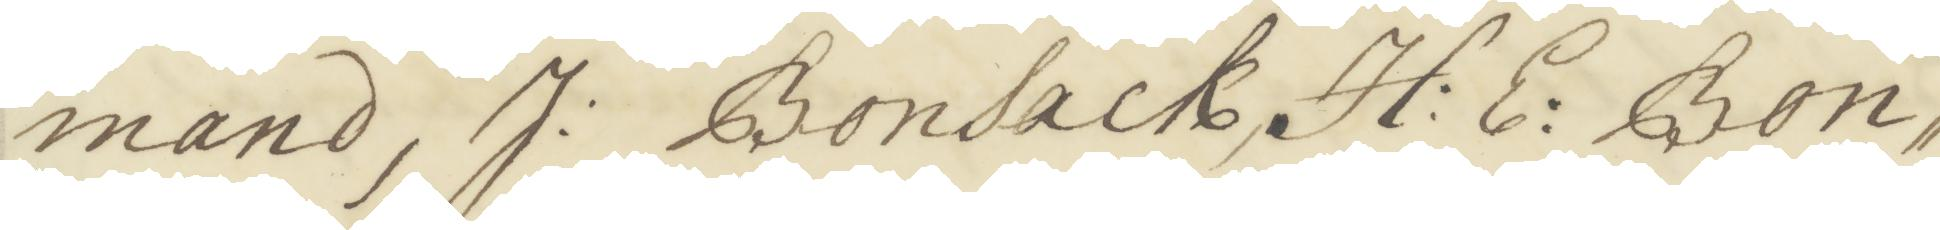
mand, J: Bonsack, H: E: Bon„
